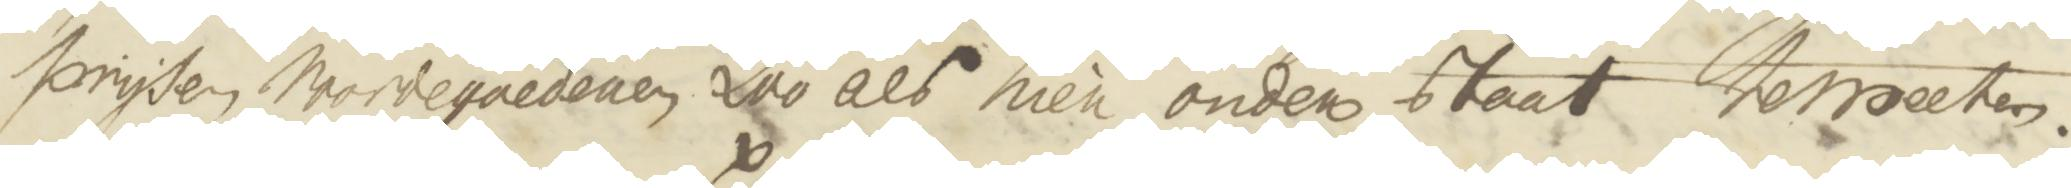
prijsen voor de goederen zoo als hier onder staat teweeten
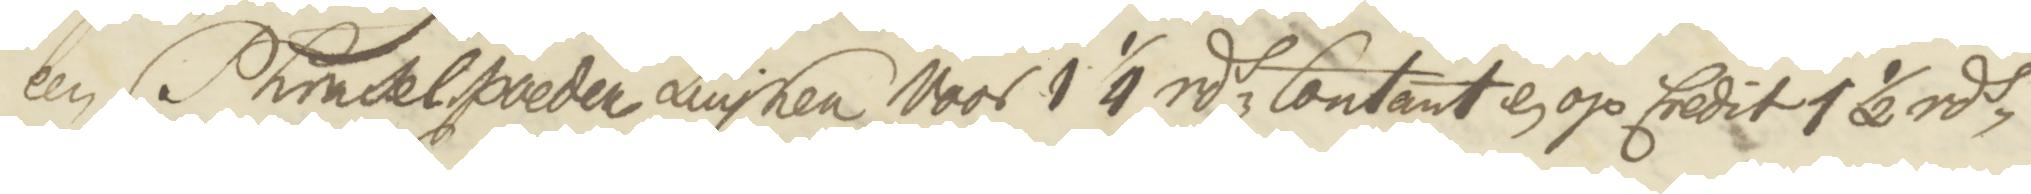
een Phrasel poeder zuijker voor 1 ¼ rd„s Contant en op Credit 1 ½ rd„s
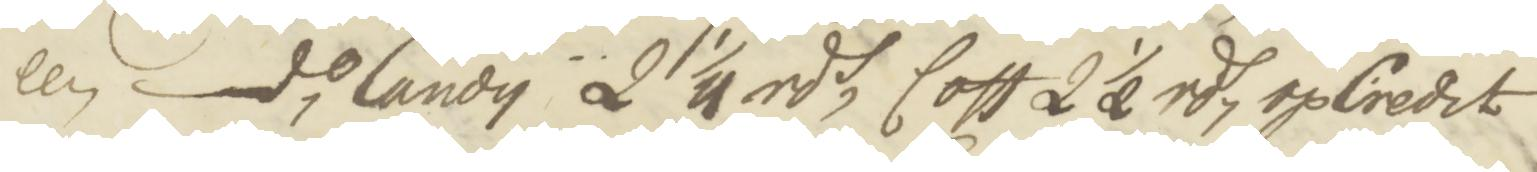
een _„o Candy 2 ¼ rd„s C off 2 ½ rd„s op Credit
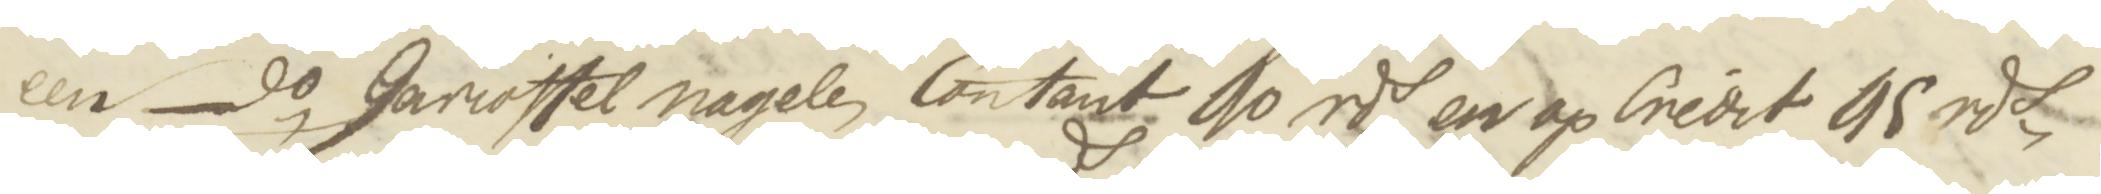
een _„o Garioffel nagelen Contant 40 rd„s en op Credit 45 rd„s
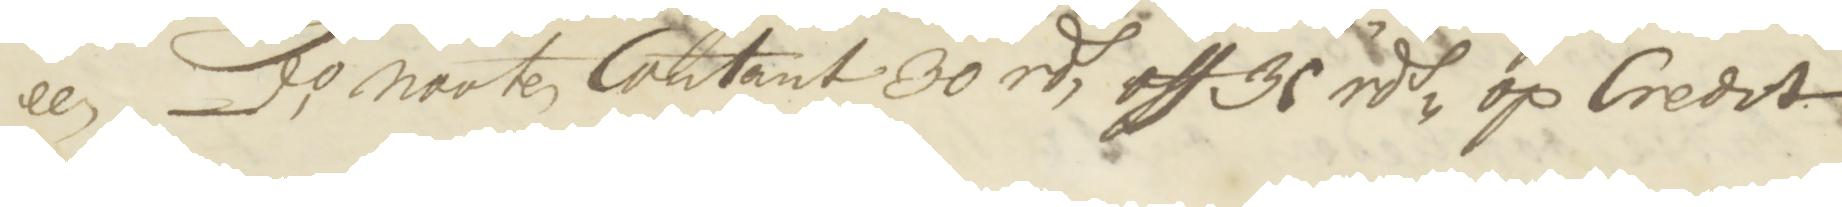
een _,o nooten Contant 30 rd,s off 35 rd„s op Credit
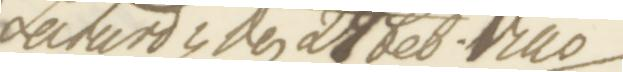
saturd„g den 27 feb 1740
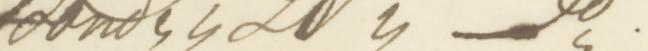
sond„g „ 28 „ _„o.
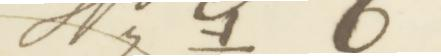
N„o 10 6,
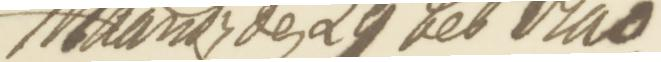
Maand:g den 29 feb 1740.
